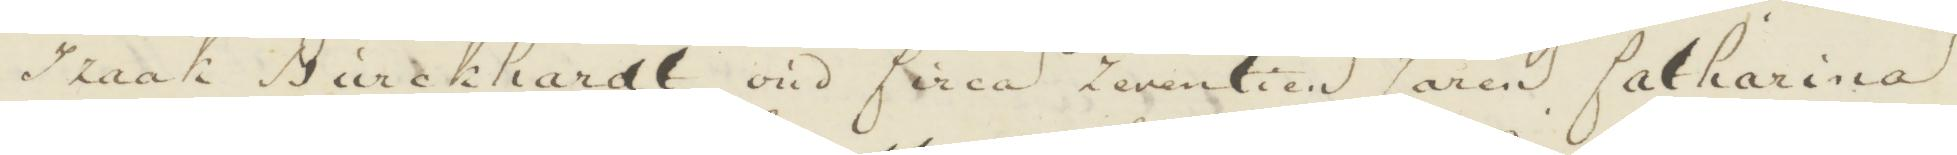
Izaak Burckhardt oud Circa zeventien Jaren, Catharina
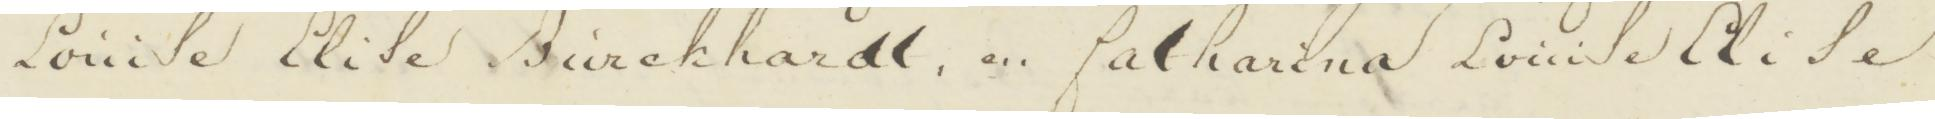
Louise Elise Burckhardt, en Catharina Louise Elise
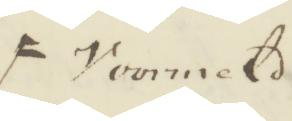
Voormeld
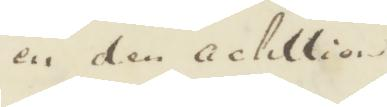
en den achttien
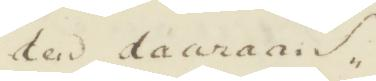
den daaraan„
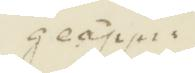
geappri
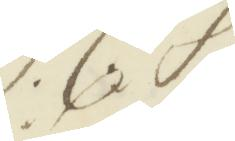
:C S
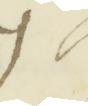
J
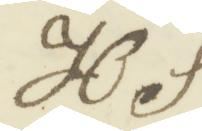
I B S
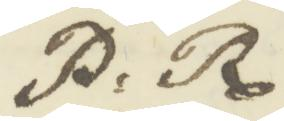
P: R
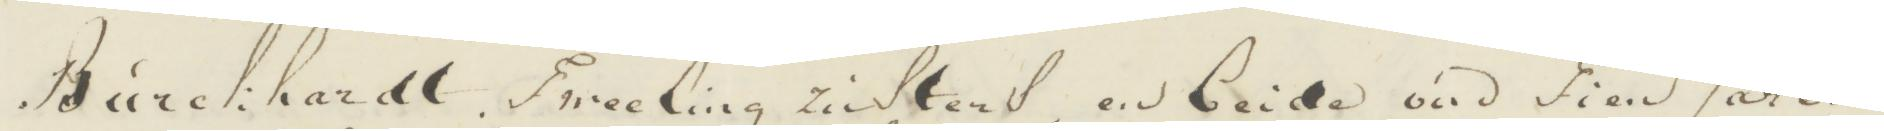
Burckhardt, Tweeling zusters, en beide oud Tien Jaren
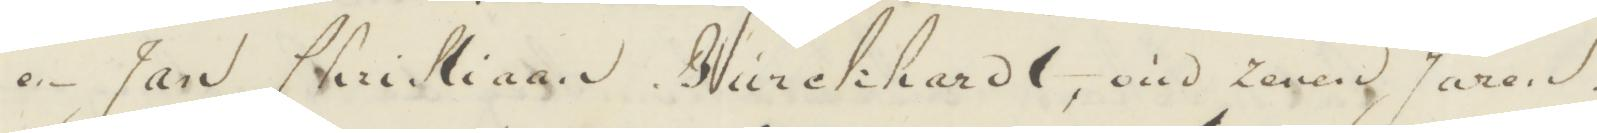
en Jan Cristiaan Burckhardt, oud zeven Jaren.
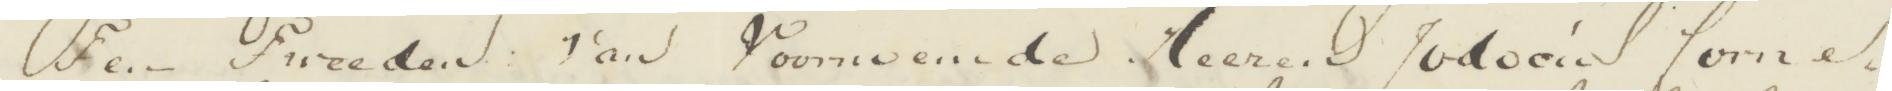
Ten Tweeden: van Voornoemde Heeren Jodocus Corne„
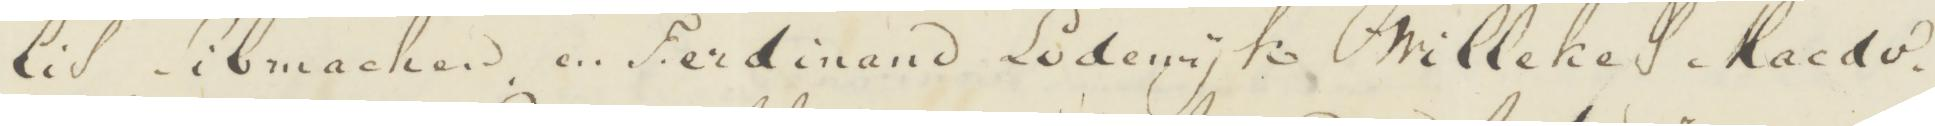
lis Libmacher en Ferdinand Lodewijk Willekse Macdo„
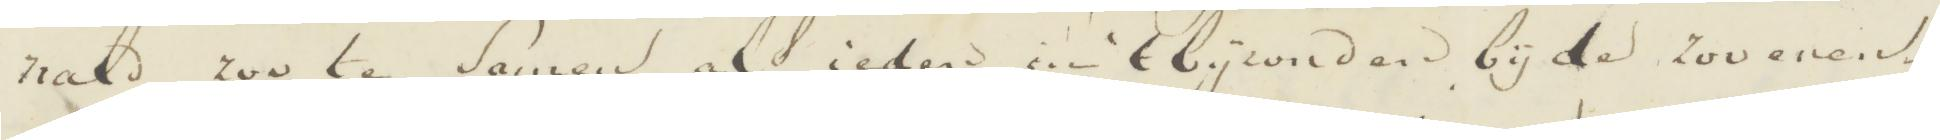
nald zoo te samen als ieder in ’t bijzonder bij de zoo even,
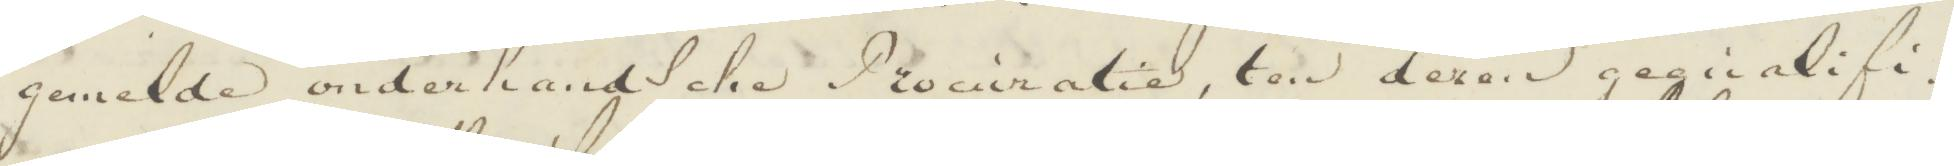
gemelde onderhandsche Procuratie, ten dezen gequalifi„
